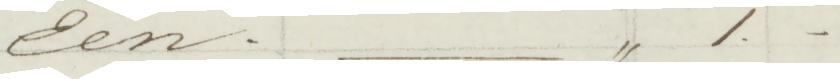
Een.— „ 1 —
